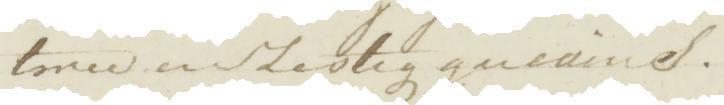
twee en zestig guldens.
